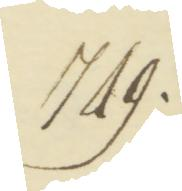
749.
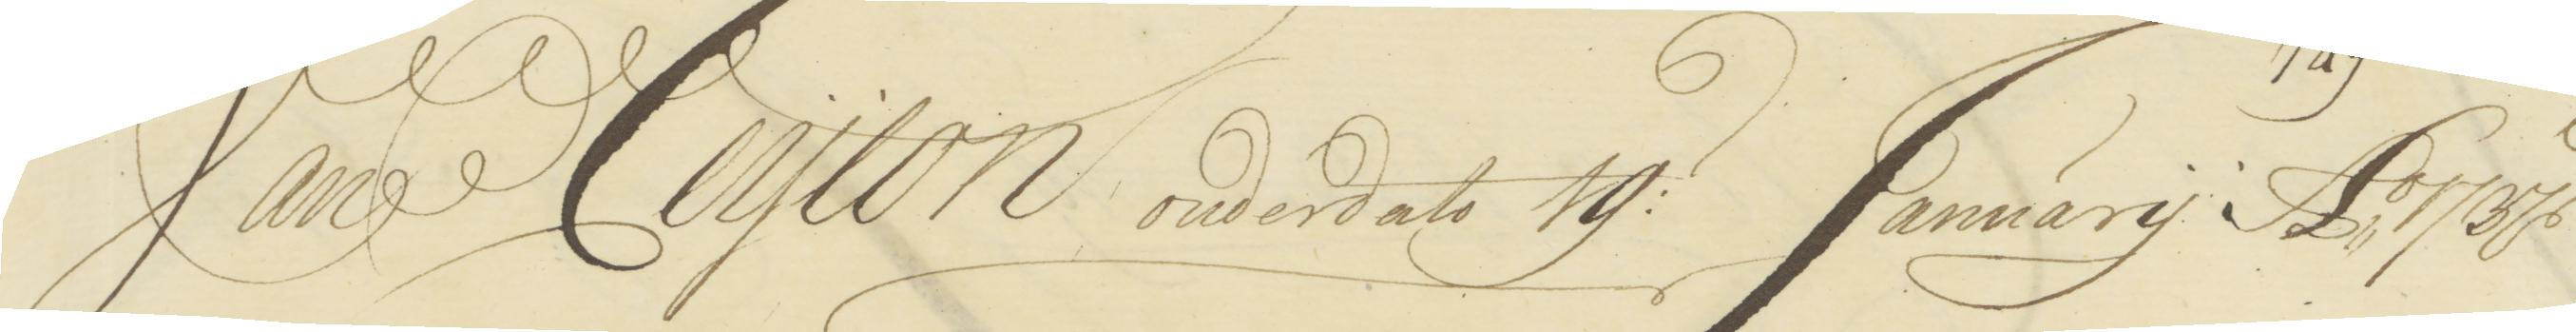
Van Ceijlon onderdato 19:' Januarij A„o 1737
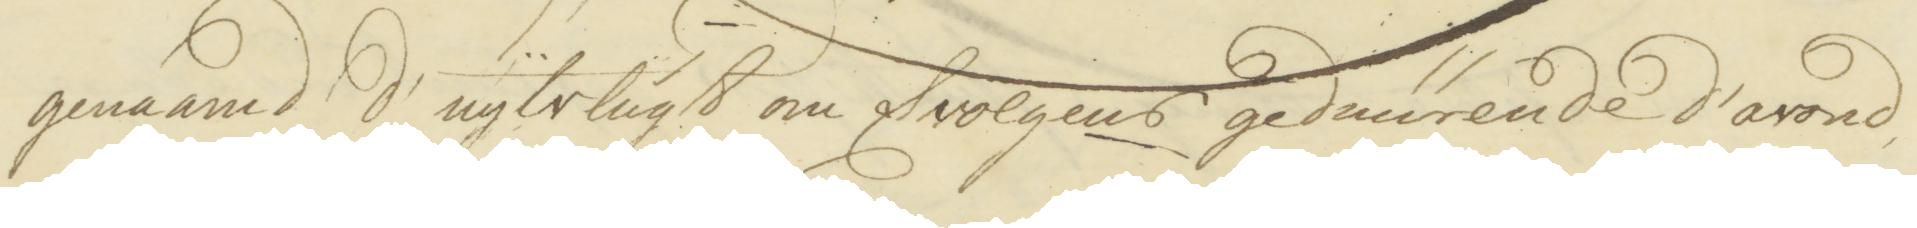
genaamd d' uijtvlugt om vervolgens geduurende d'avond,
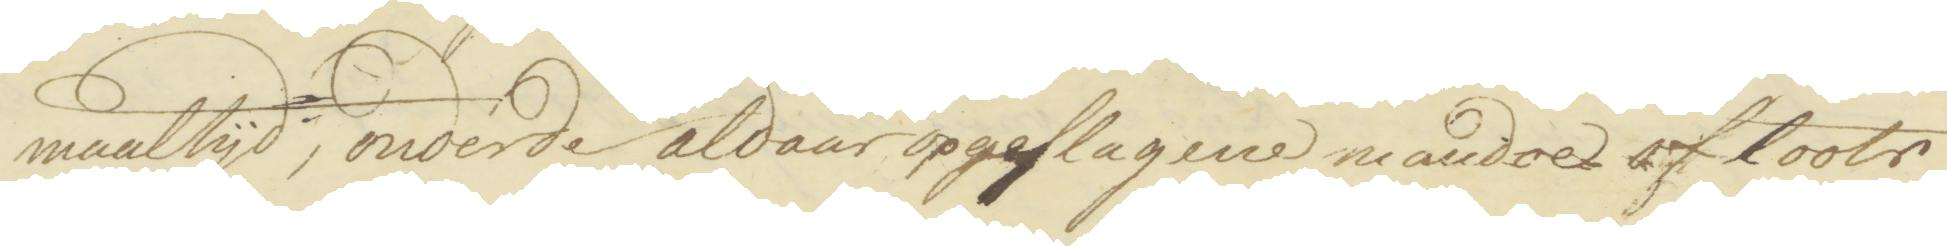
maaltijd, onderde aldaar opgeslagene mandoe of loots
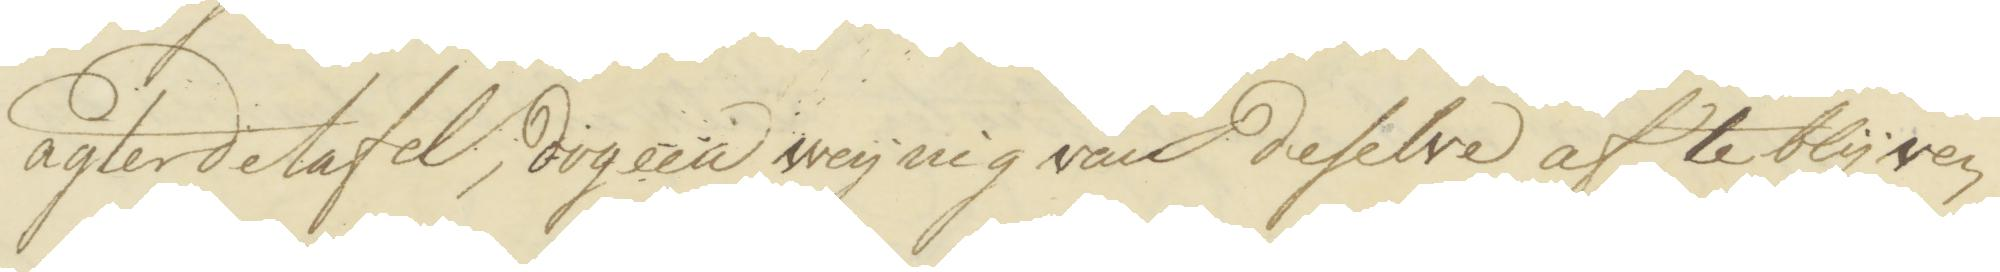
agter de tafel, dog een weijnig van deselve af te blijven
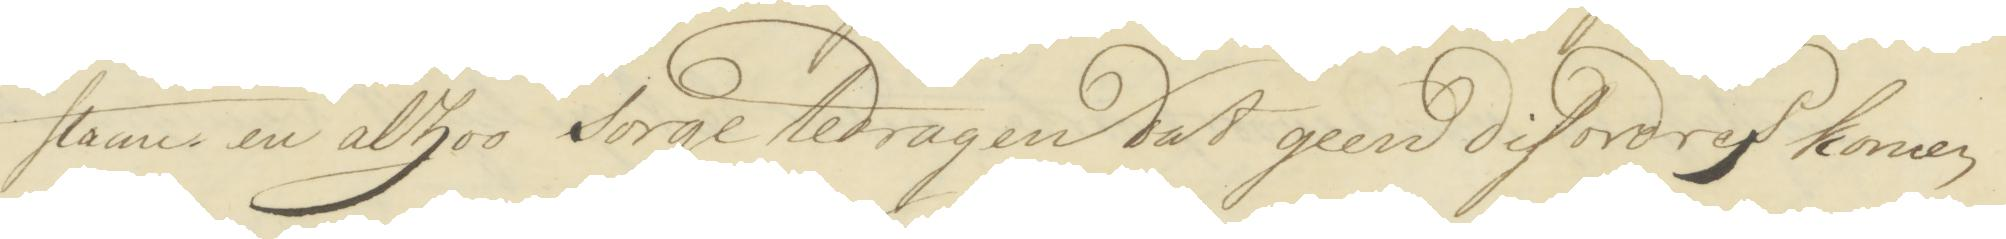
staan en alzoo sorge tedragen dat geen disordres komen
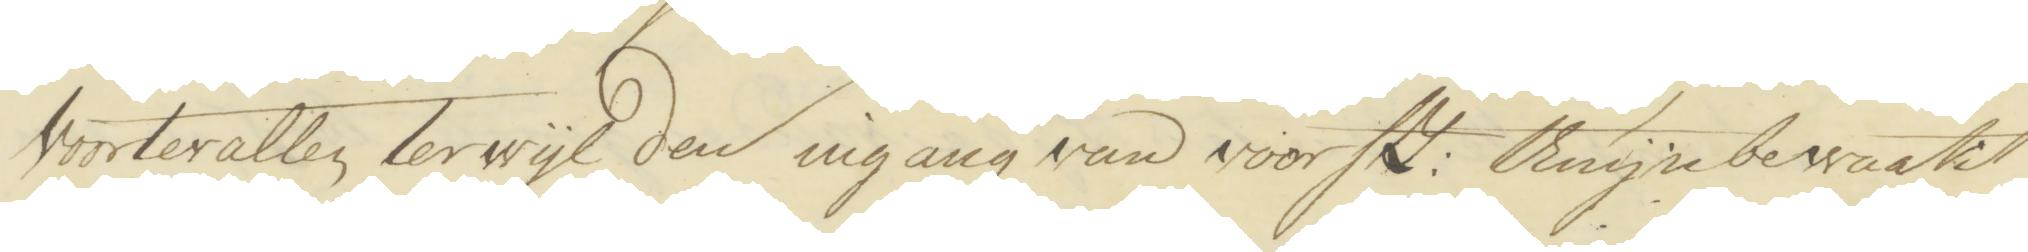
Voortevallen terwijl den ingang van voorsz: thuijn bewaakt
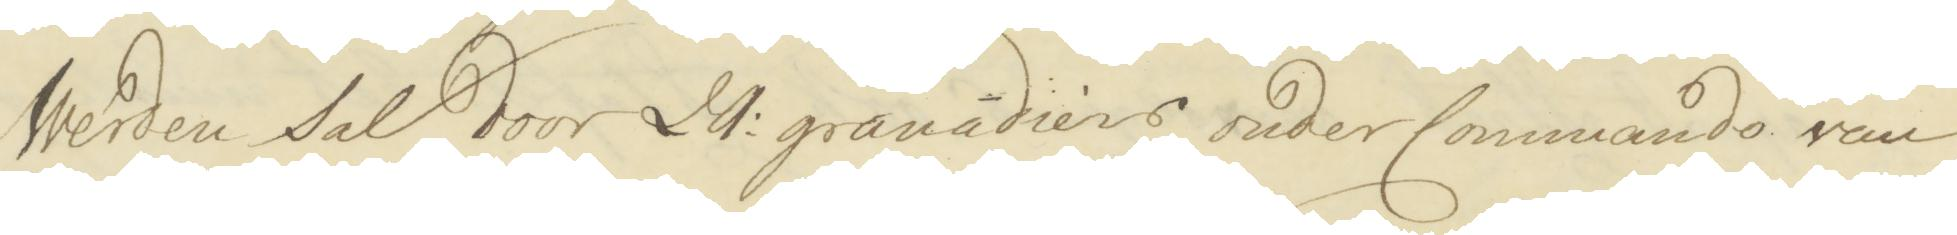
Werden sal door 24: granadiers onder Commando van
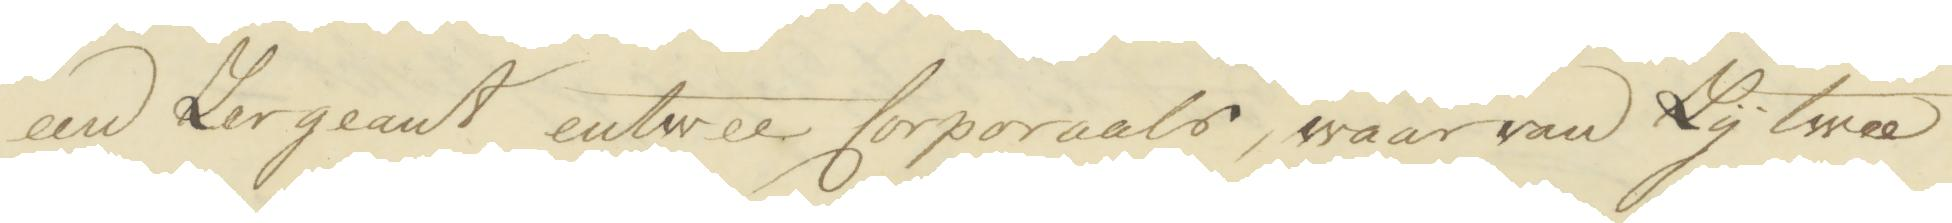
een zergeant entwee Corporaals, waar van zij twee
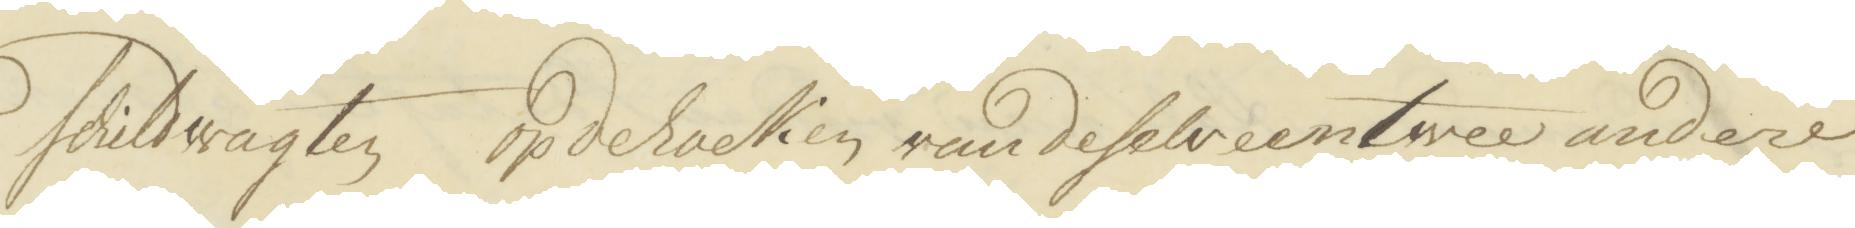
schildwagten op dehoeken van deselveen twee andere
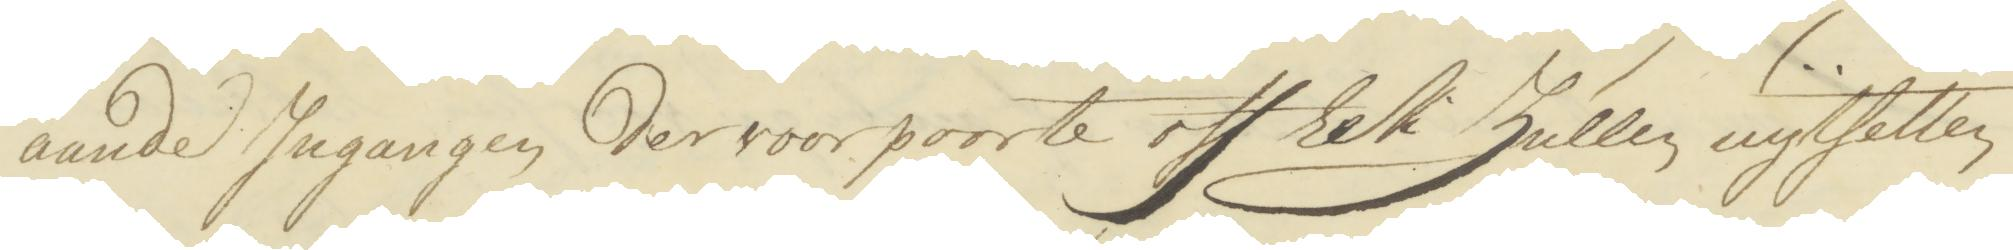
aande Jngangen der voor poorte off hek zullen uijtsetten
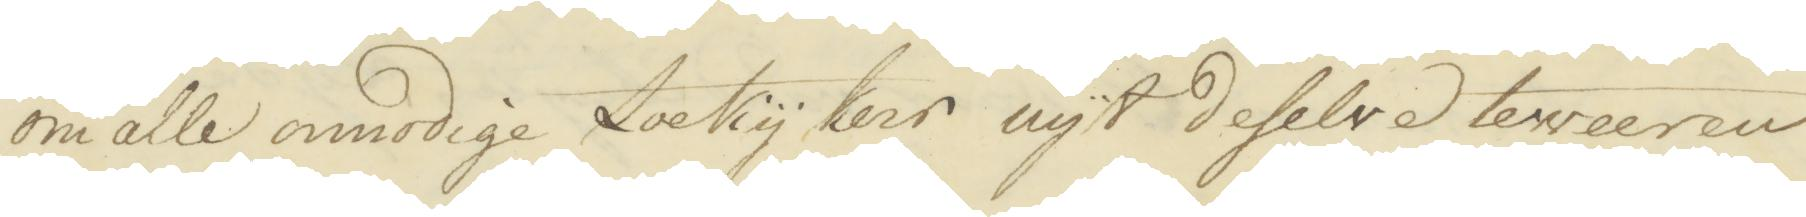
om alle onnodige toekijkers uijt deselve teweeren
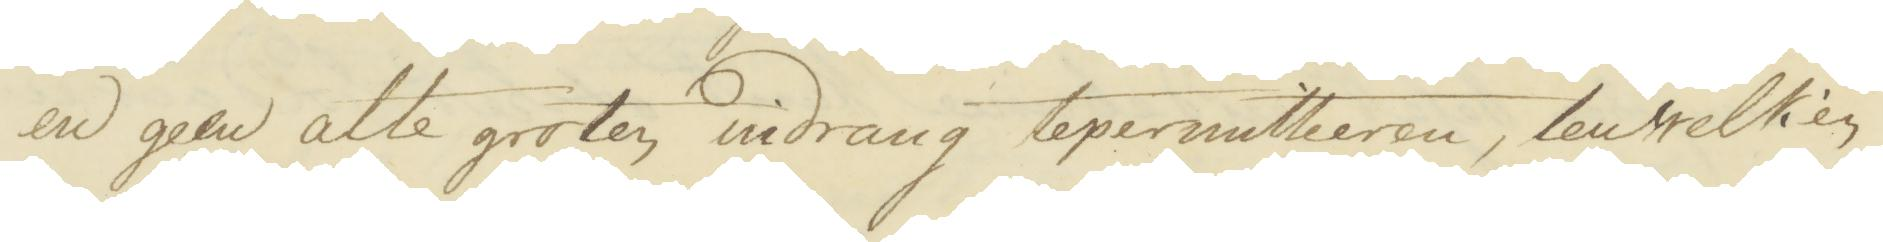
en geen alte groten indrang tepemitteeren, ten welken
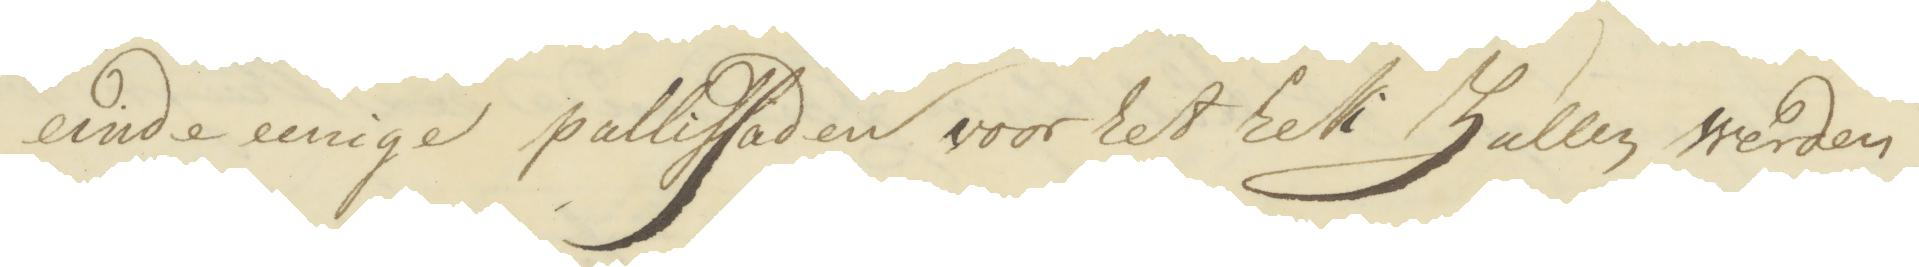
einde eenige pallissaden voor het hek zullen werden
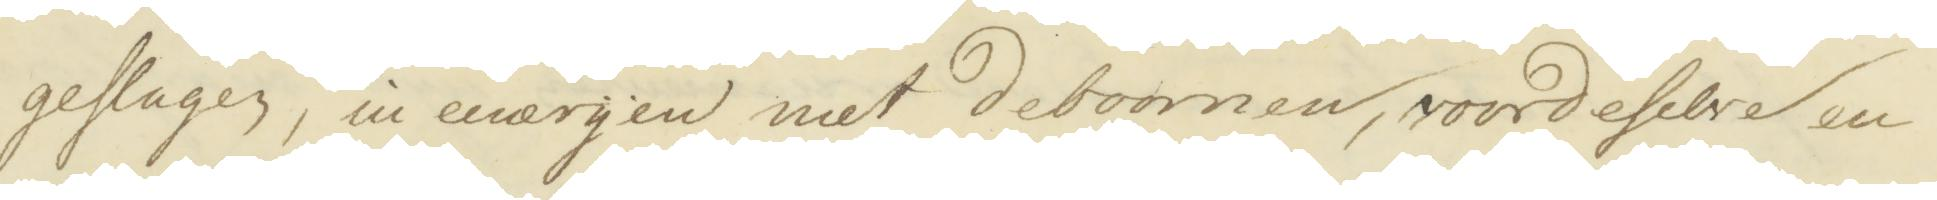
geslagen, in eenerijen met deboomen, voor deselve en
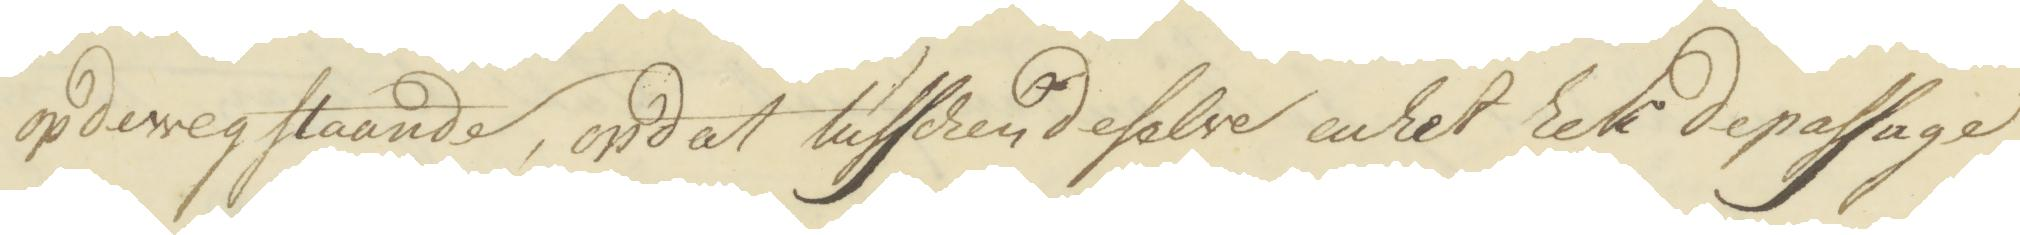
op deweg staande, opdat tusschen deselve en het hek depassage
